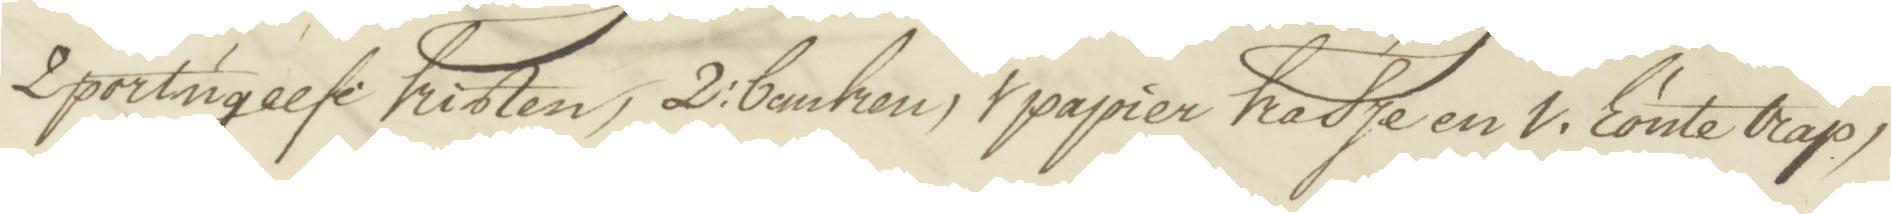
2 portugeefi kisten, 2: banken, 1 papier kasje en 1. houte trap,
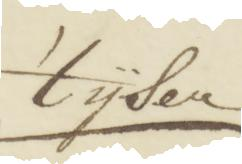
't ijser
